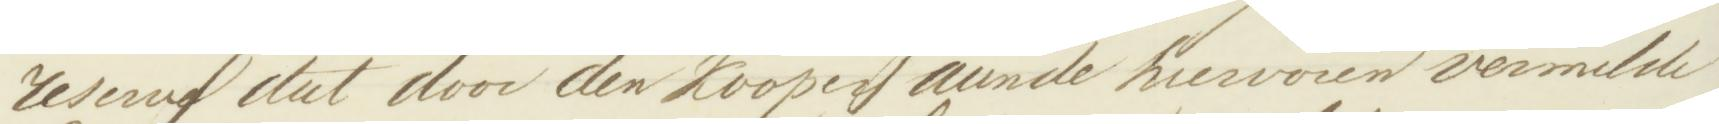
reserve dat door den kooper aan de hiervoren vermelde
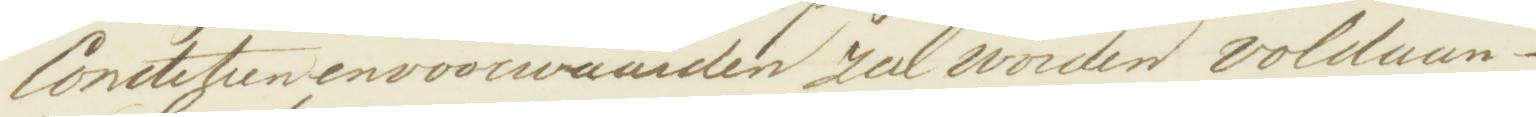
Conditien en voorwaarden zal worden voldaan
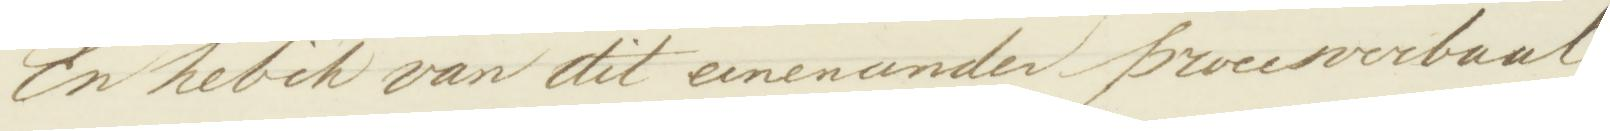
En heb ik van dit een en ander procesverbaal
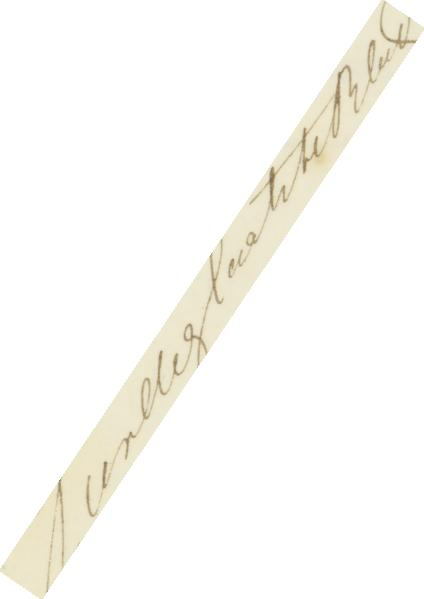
Vierde & laatste Blad
